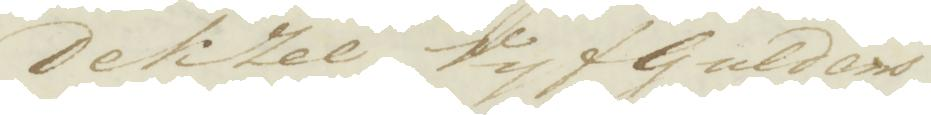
dekzel, Vyf Guldens
